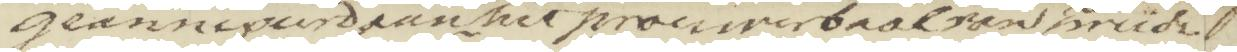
Geannexeerd aan het procesverbaal van Kruch
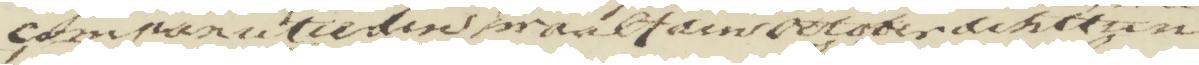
Comparatie den twaalfden october achttien
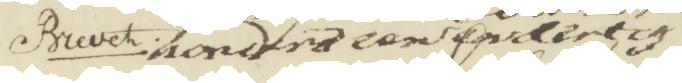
Brevet. honderd een en dertig
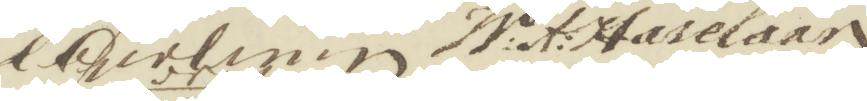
E Gerlings W:A: Haselaar
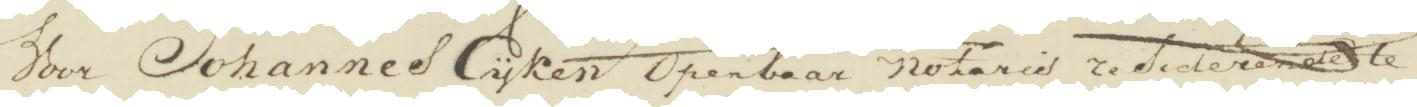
Voor Johannes Eijken Openbaar Notaris residerende te
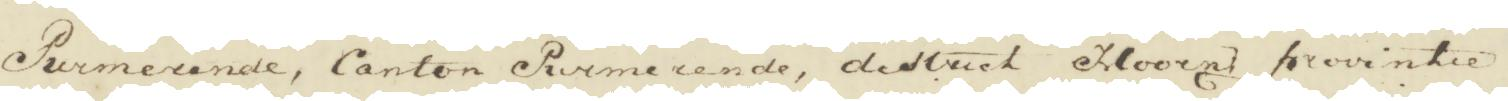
Purmerende, Canton Purmerende, district Hoorn provintie
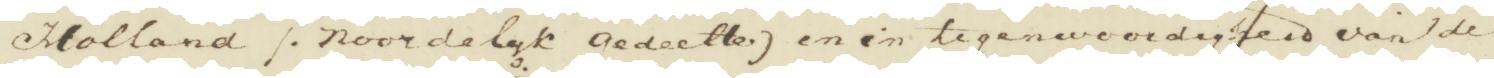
Holland /. Noordelijk gedeelte.) en in tegenwoordigheid van de
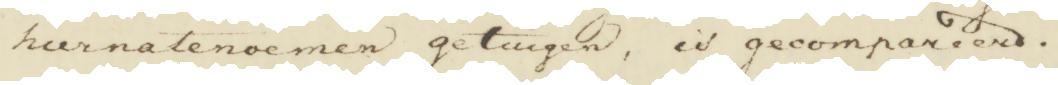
hiernatenoemen getuigen, is gecompareerd.
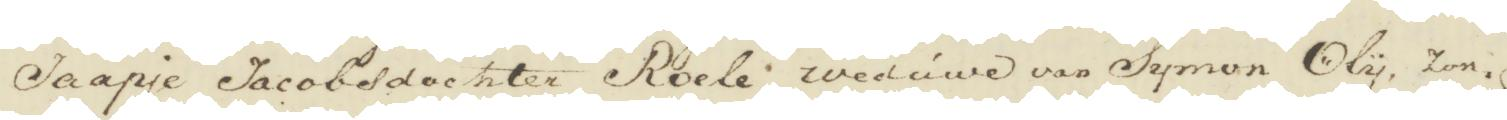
Jaapje Jacobsdochter Roele weduwe van Symon Olij, zon,
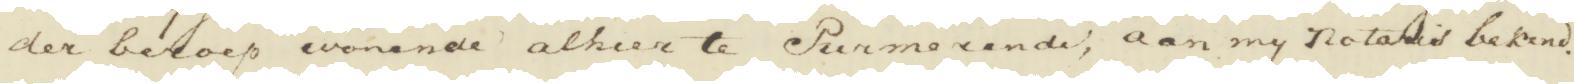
der beroep wonende alhier te Purmerende, aan my Notaris bekend
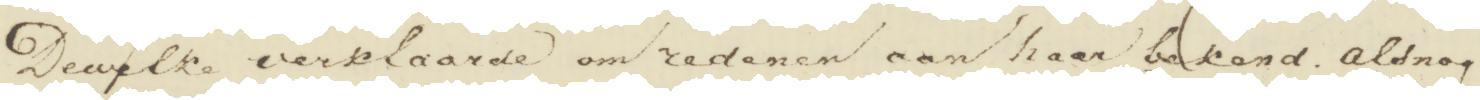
Dewelke verklaarde om redenen aan haar bekend, alsnog
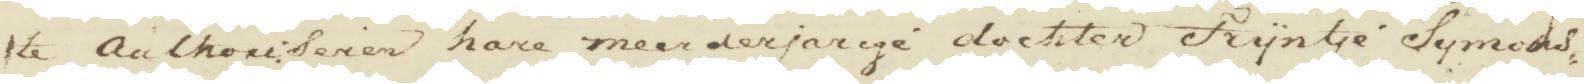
te Authoriseren hare meerderjarige dochter Trijntje Symons
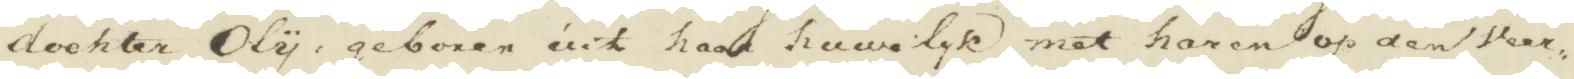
dochter Olij, geboren uit haar huwelyk met haren op den veer
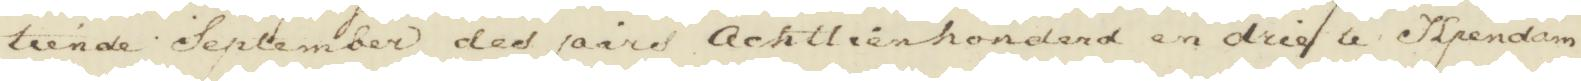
tiende september des jaars Achttienhonderd en drie te Ilpendam
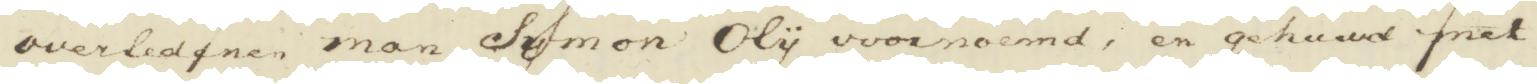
overledenen man Sijmon Olij voornoemd; en gehuwd met
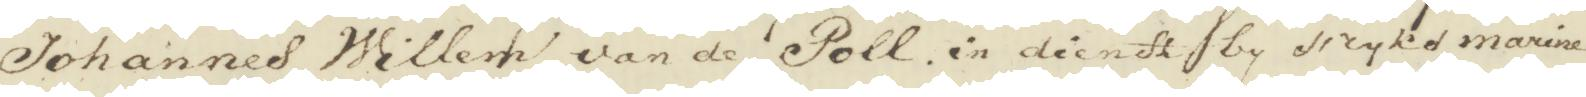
Johannes Willem van de Poll, in dienst by de ryks marine
